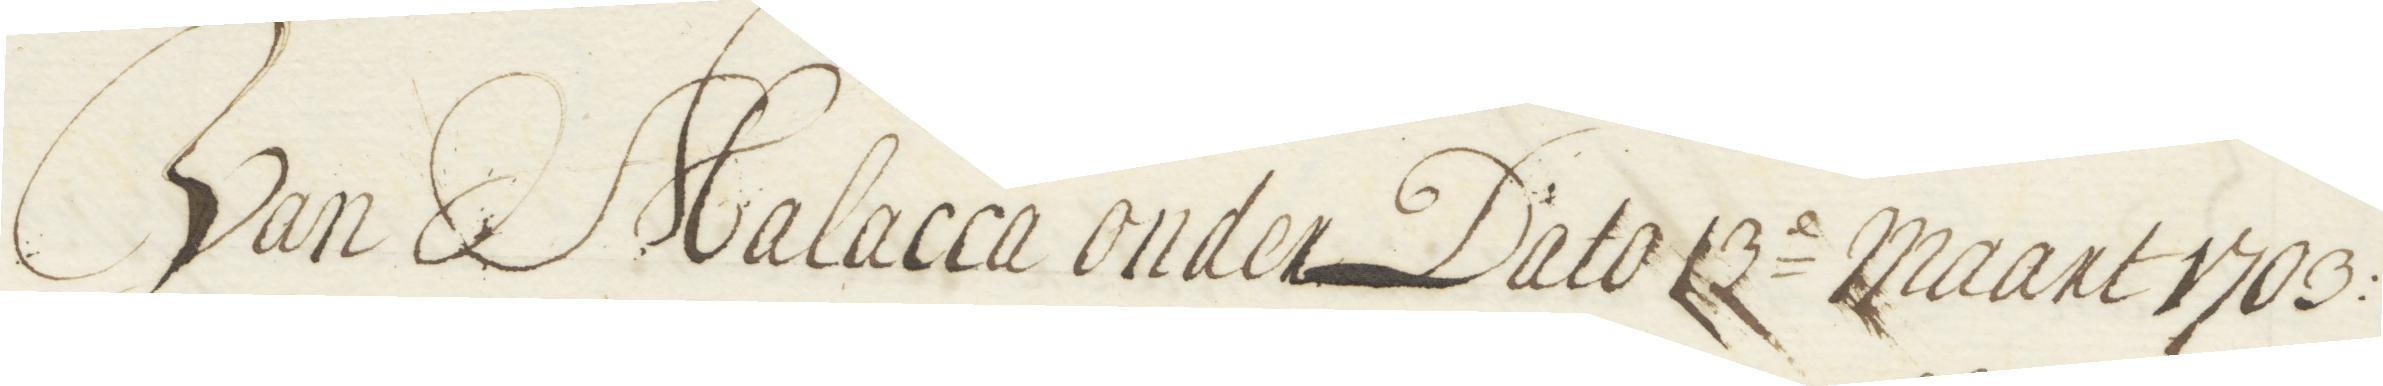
Van Malacca onder Dato 13=e maart 1703:
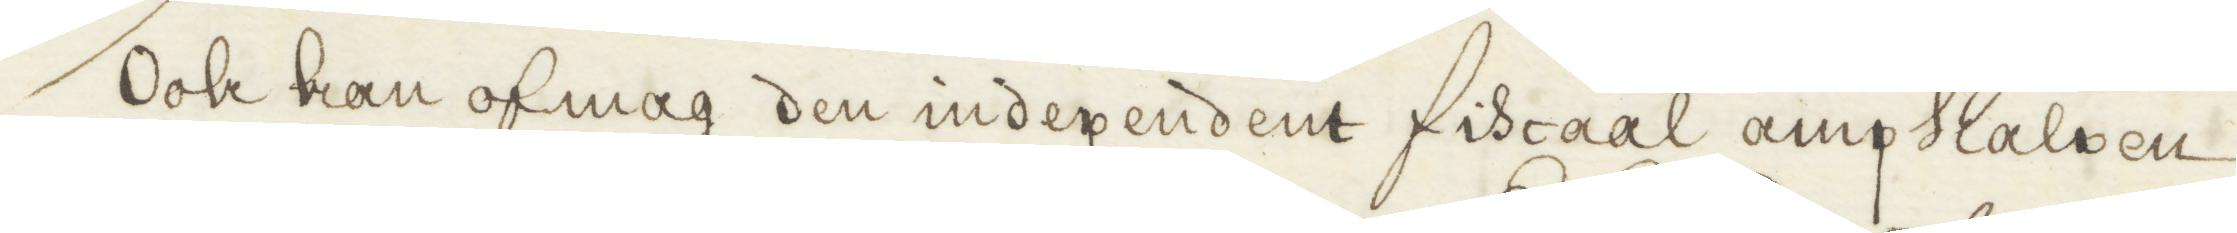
Ook kan of mag den independent fiscaal ampshalven
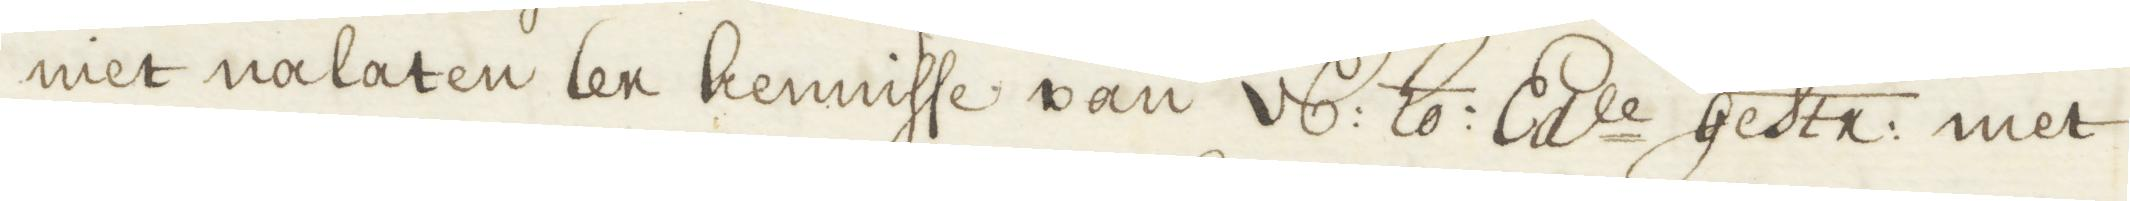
niet nalaten ter kennisse van VE: Ho: Ed=le gestr: met
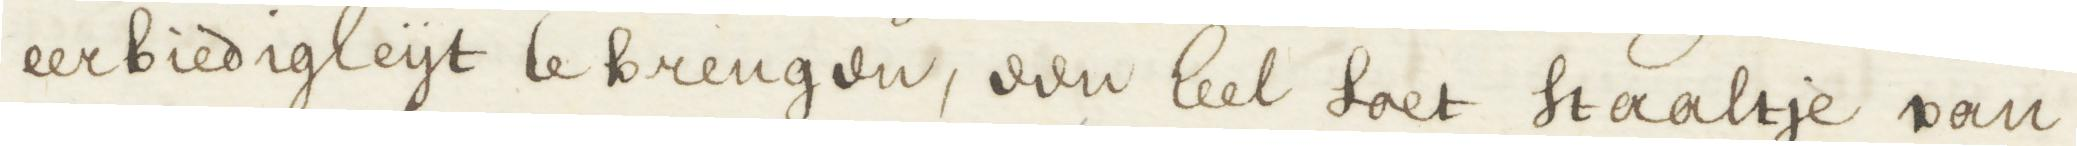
eerbiedigheijt te brengen, een heel soet staaltje van
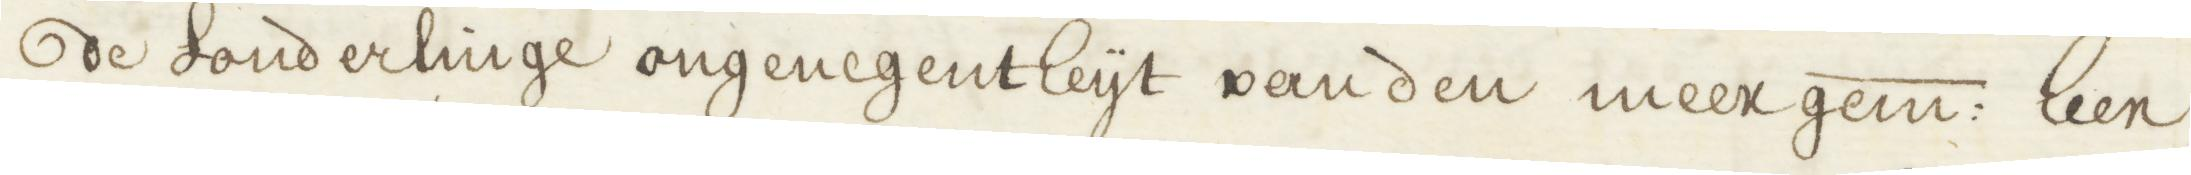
de sonderlinge ongenegentheijt van den meergem: heer
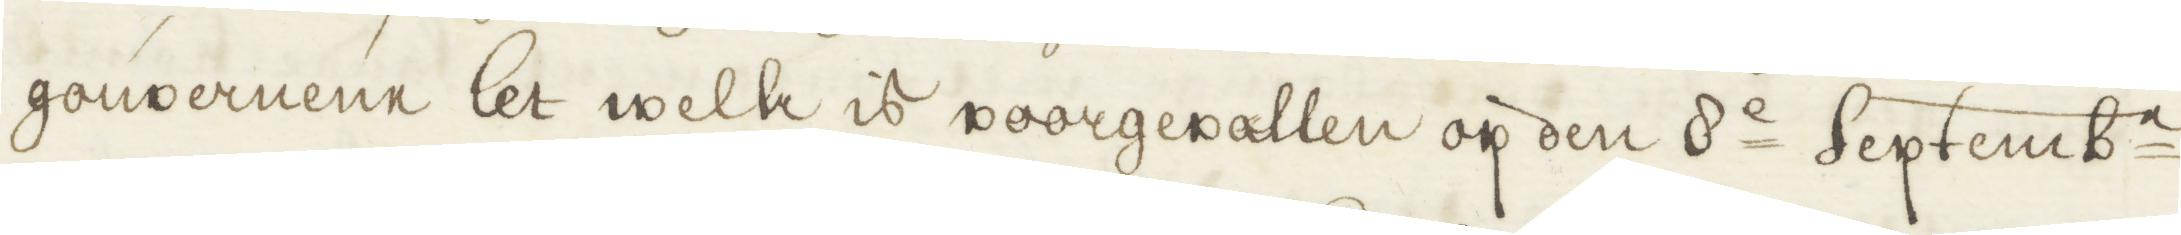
gouverneur het welk is voorgevallen op den 8=e Septemb=r
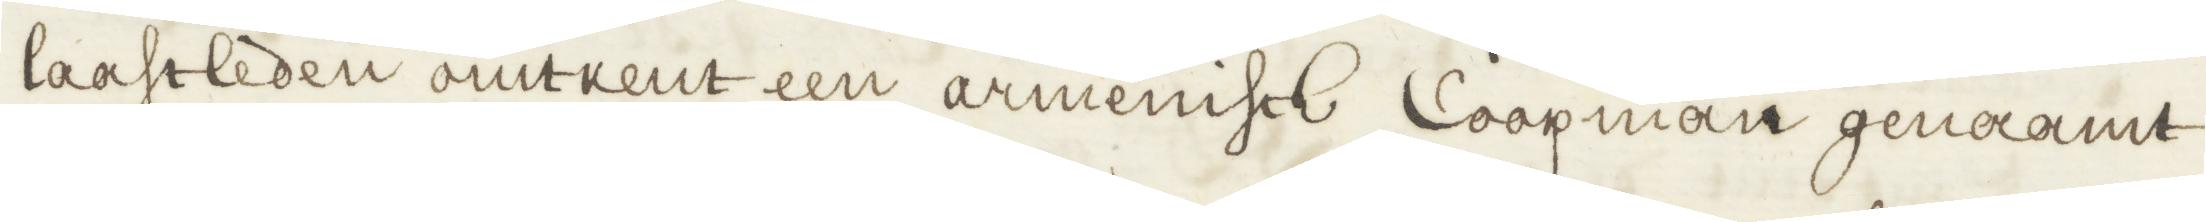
laastleden omtrent een armenisch Coopman genaamt
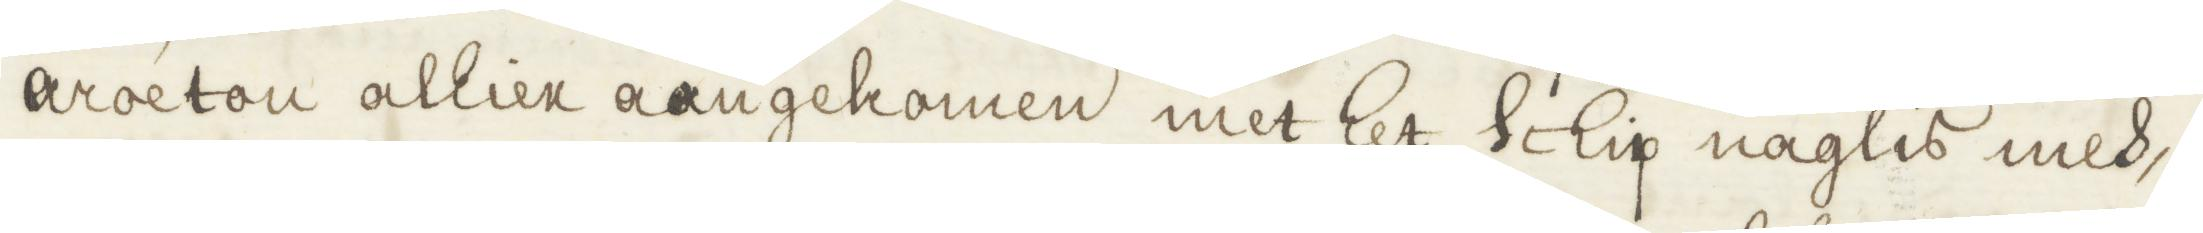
aroeton alhier aangekomen met het Schip naglis mes„
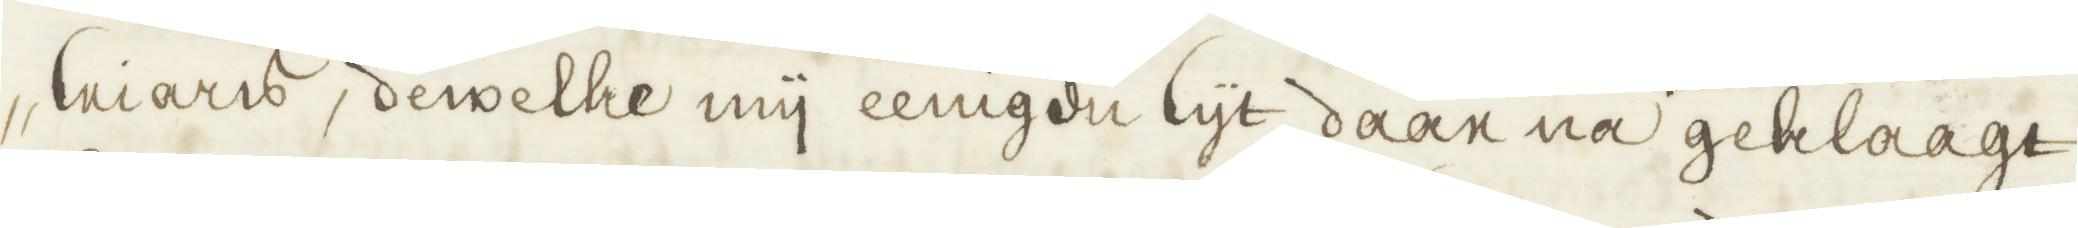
„triaris, dewelke mij eenigen tijt daar na geklaagt
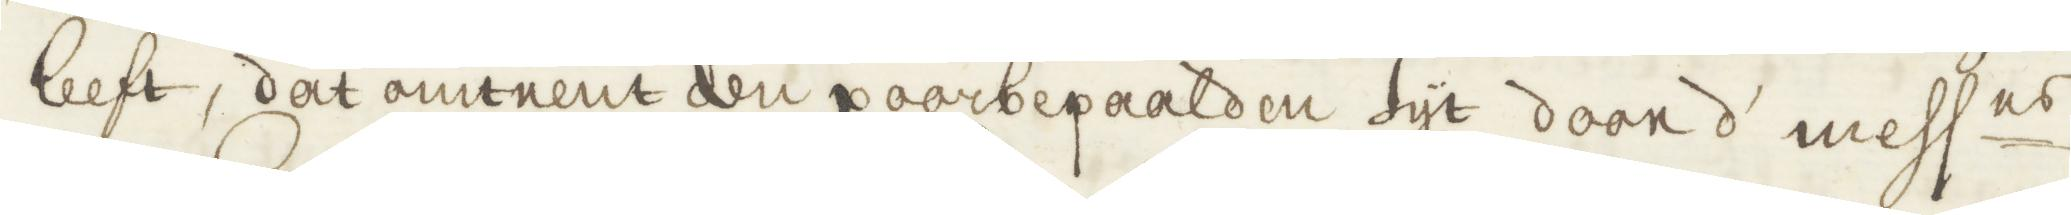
heeft, dat omtrent den voorbepaalden tijt door d’ mess=rs
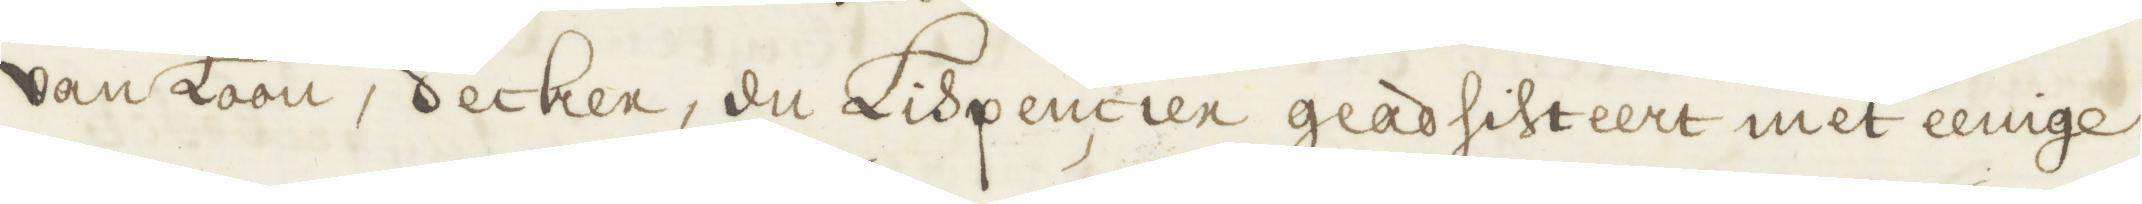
van Loon, decker, en Lispencier geadsisteert met eenige
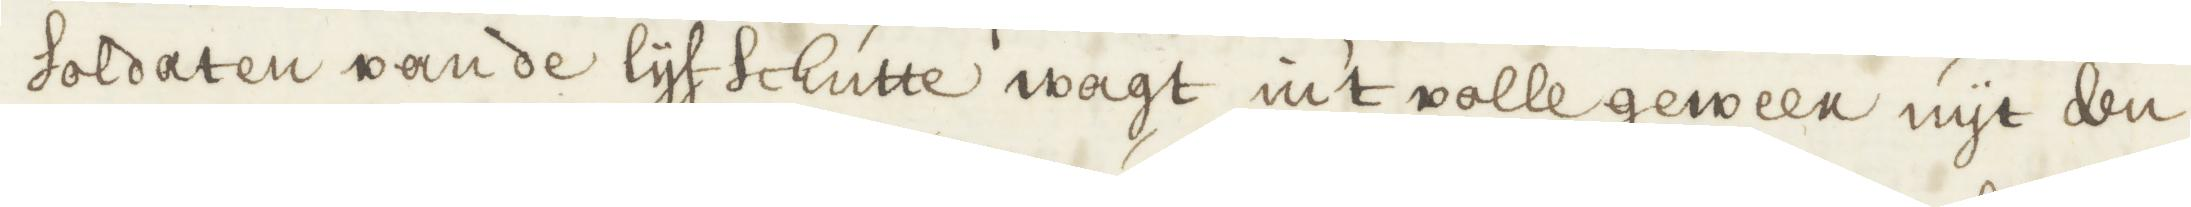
soldaten van de lijfschutte wagt in’t volle geweer uijt den
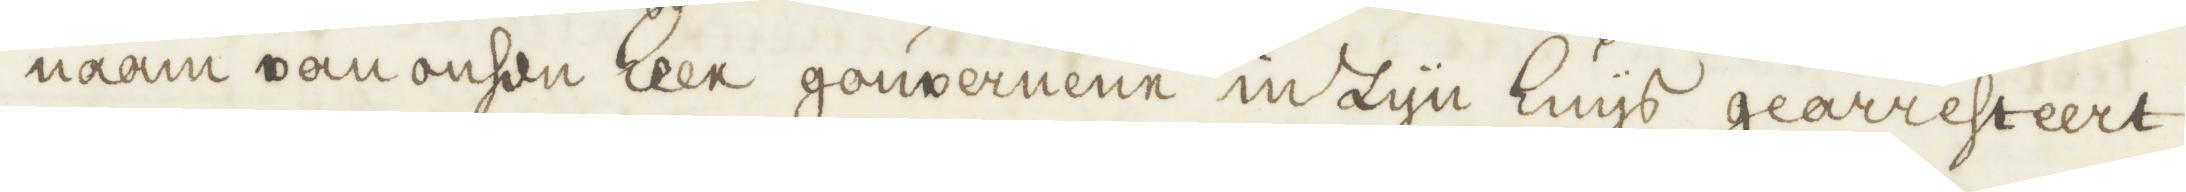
naam van onsen heer gouverneur in zijn huijs gearresteert
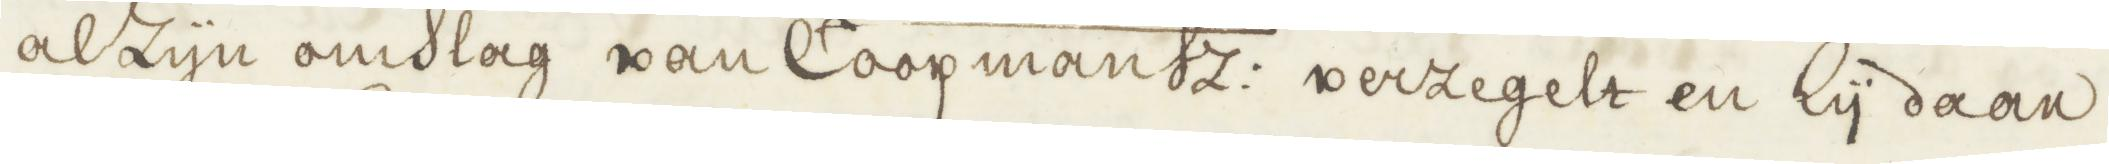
al zijn omslag van Coopmansz: verzegelt en hij daar
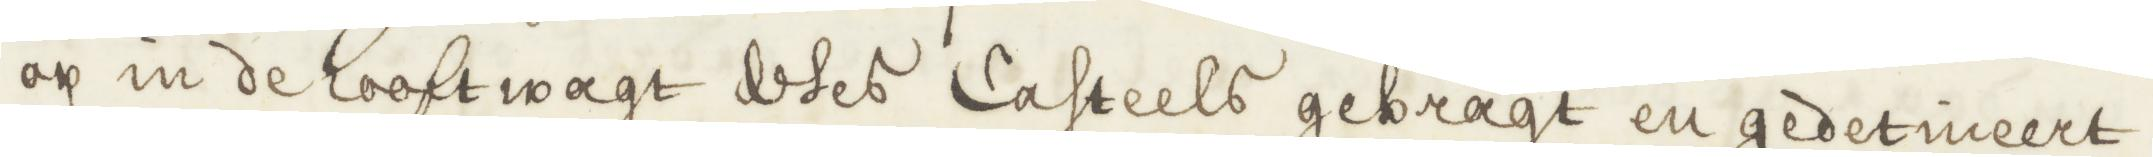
op in de hooftwagt deses Casteels gebragt en gedetineert
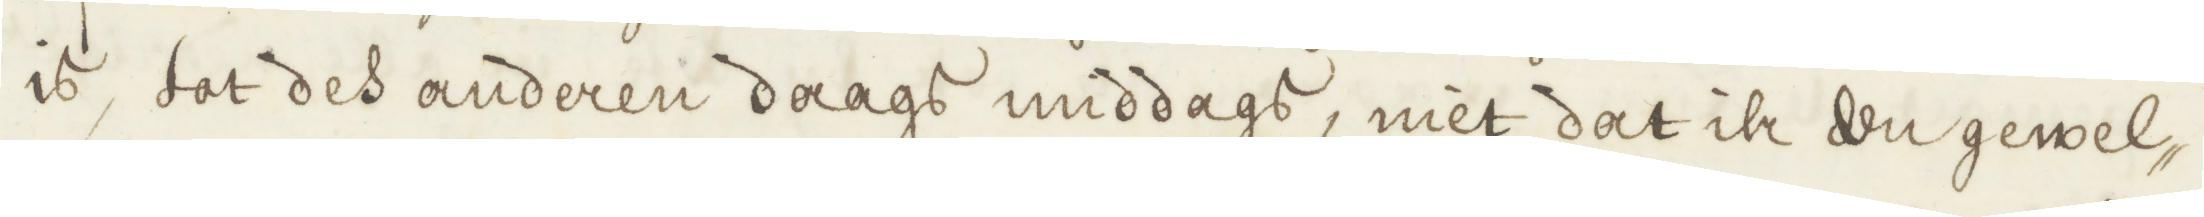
is, tot des anderen daags middags, niet dat ik den gewel„
